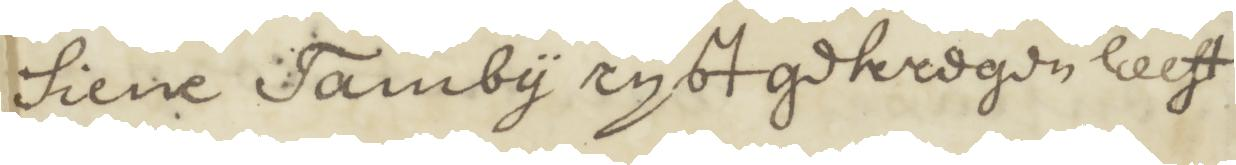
Siene Tambij rijstgekregen heeft
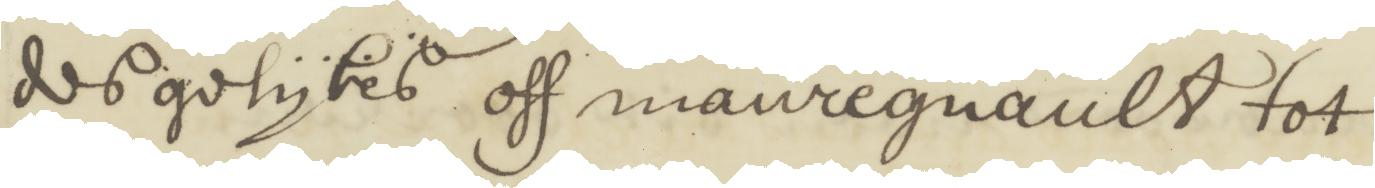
des gelijks off mauregnault tot
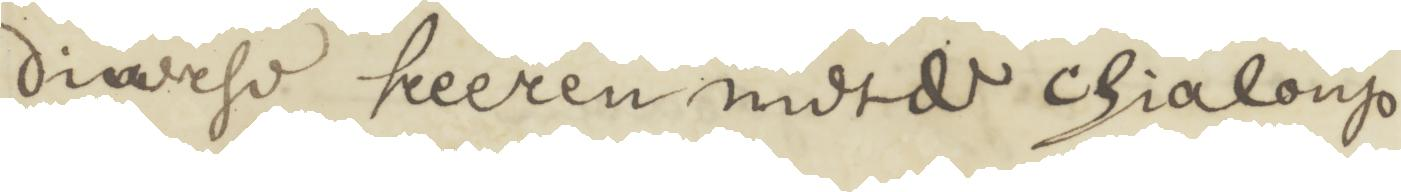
diverse keeren met de Chialoup
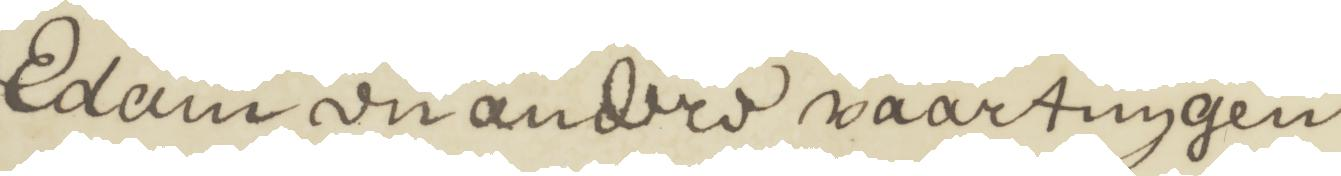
Edam en andere vaartuijgen
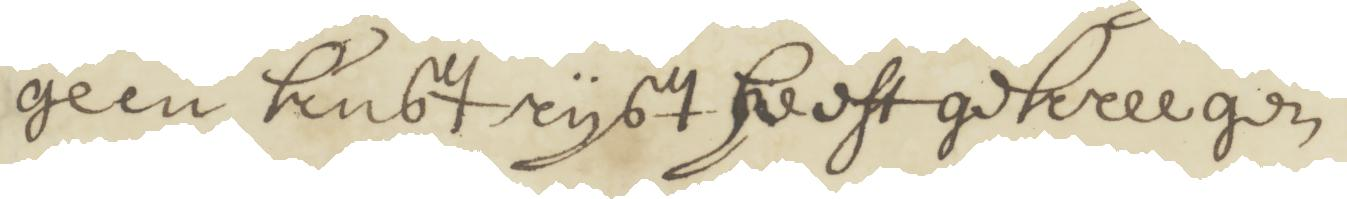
geen kust rijst heeft gekreegen
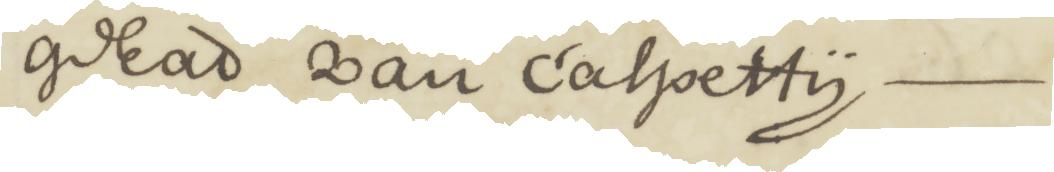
gehad van Calpettij
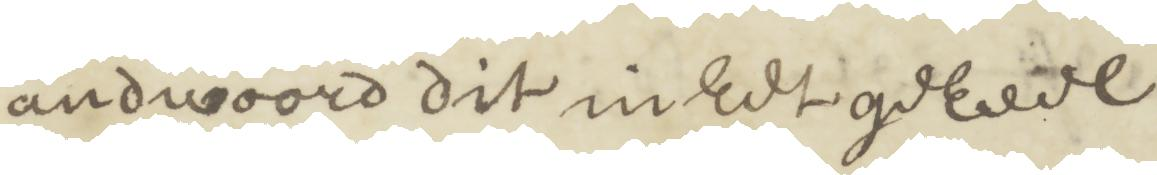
andwoord dit in het geheel
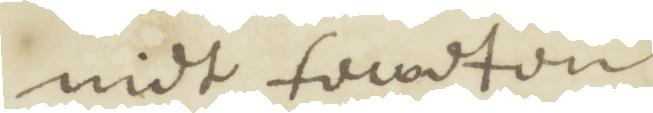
niet teweten
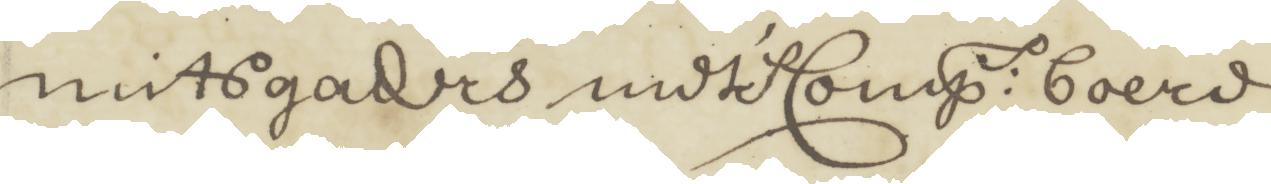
mitsgaders met 's Comp:s boere
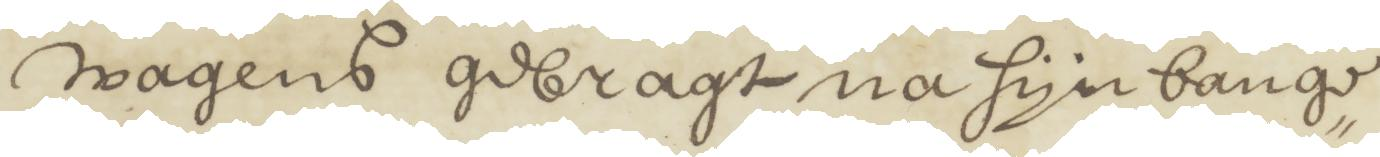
wagens gebragt na sijn bange„
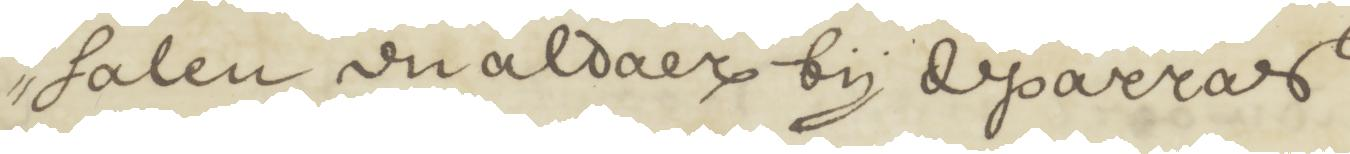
„salen en aldaer bij de parraes
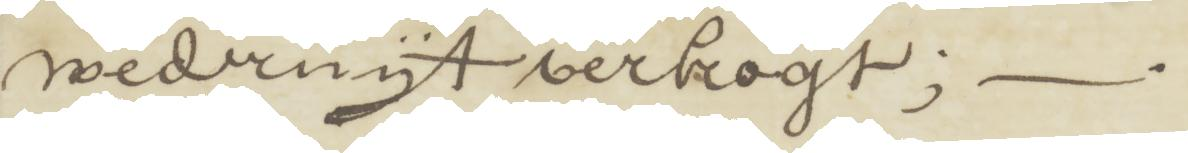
weder uijt verkogt; ~
